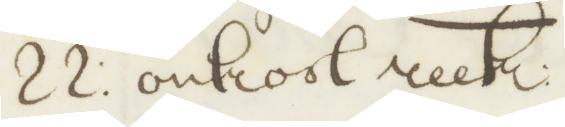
22: onkost reek:
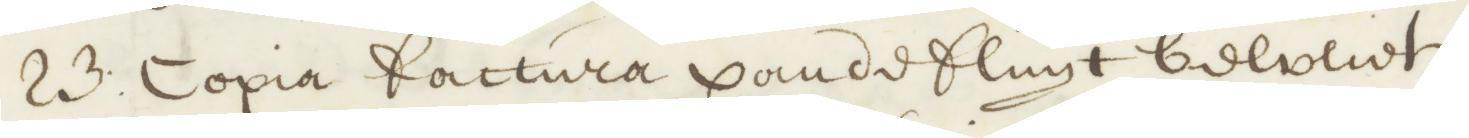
23: Copia factura van de fluijt belvliet
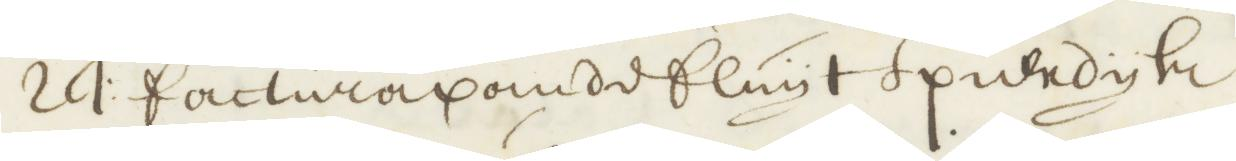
24: factura van de fluijt spierdijk
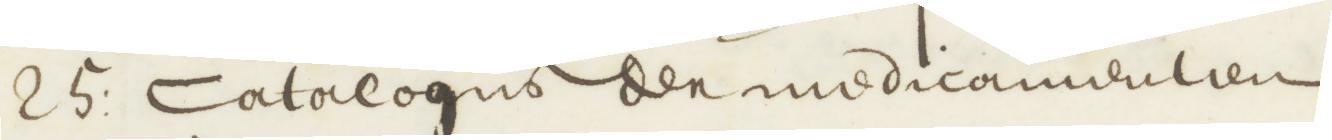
25: catalogus der medicamenten
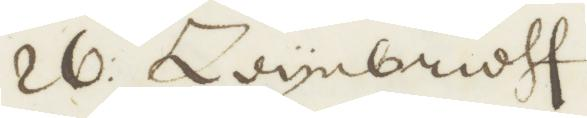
26: zeijnbrieff
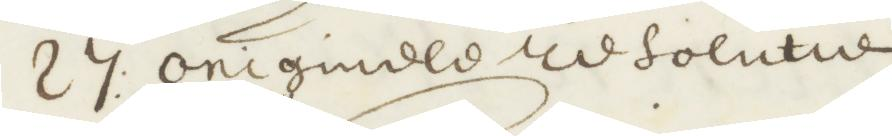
27: originele resolutie
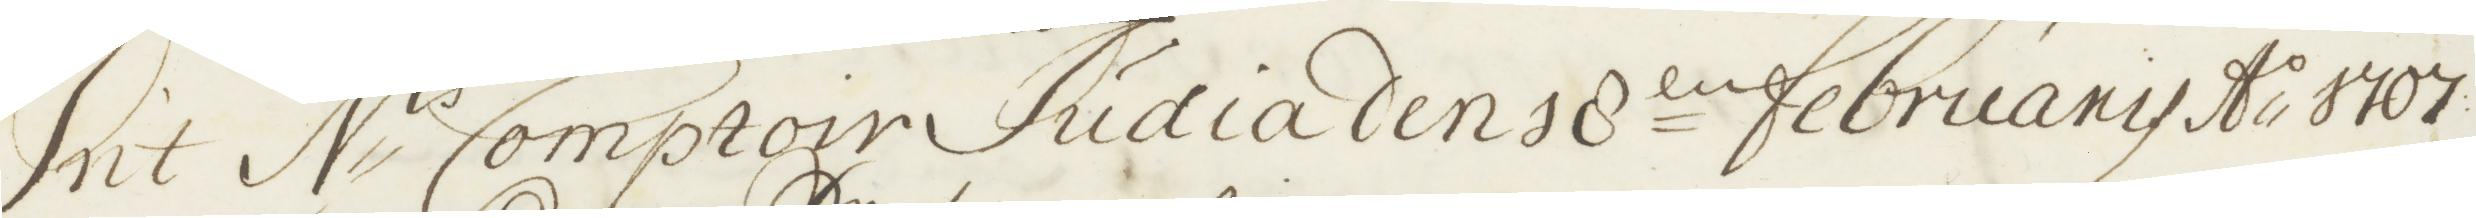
Jn't N„ts Comptoir Judia den 18=en februarij A„o 1707:
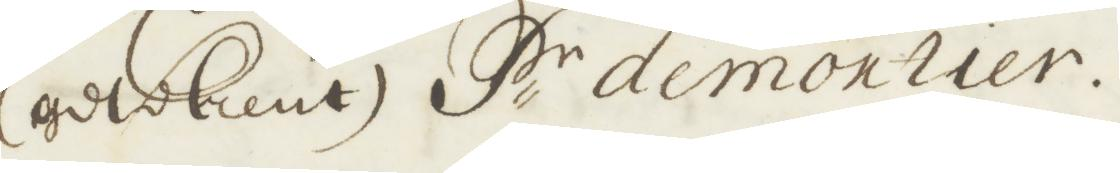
(getekent) P„r demortier.
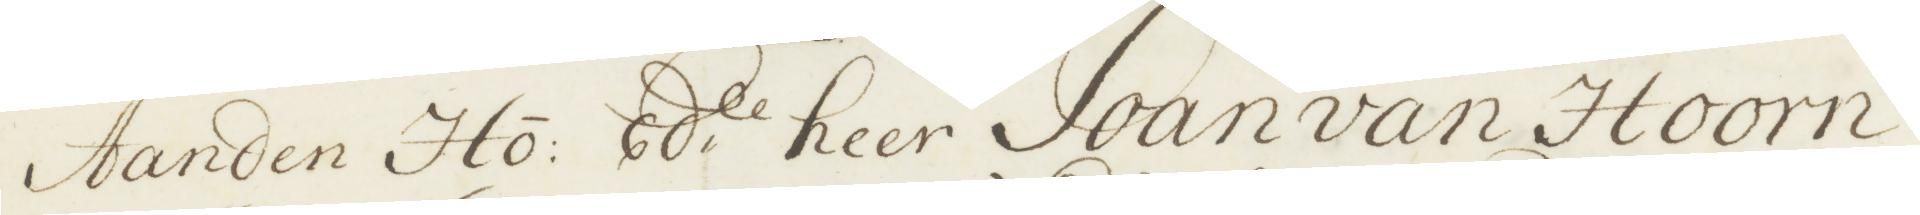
Aan den Ho: Ed„le heer Joan van Hoorn
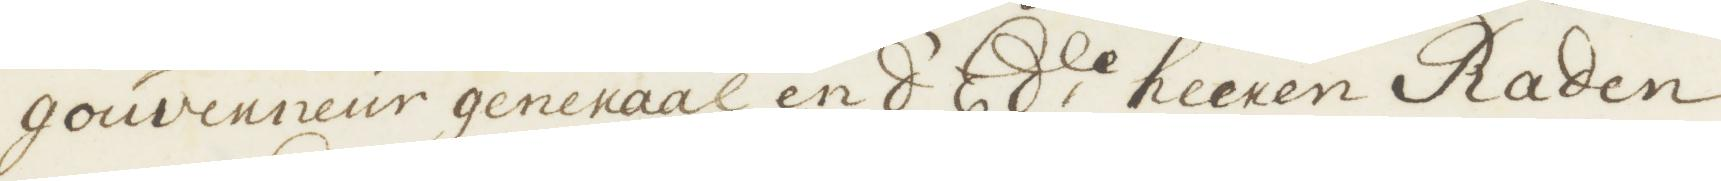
gouverneur generaal en d’Ed„le heeren Raden
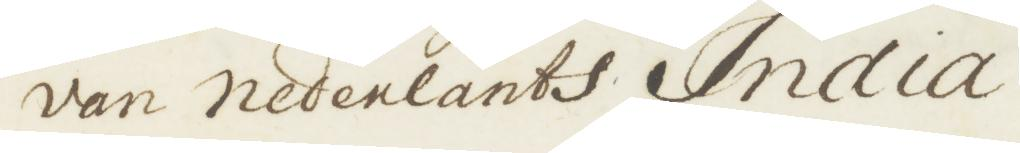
van nederlants Jndia
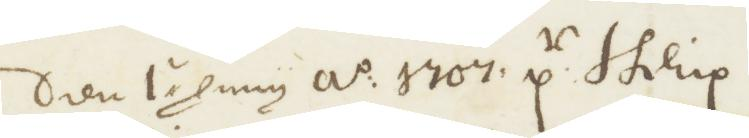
den 1„' Junij a:o 1707: p:r tschip
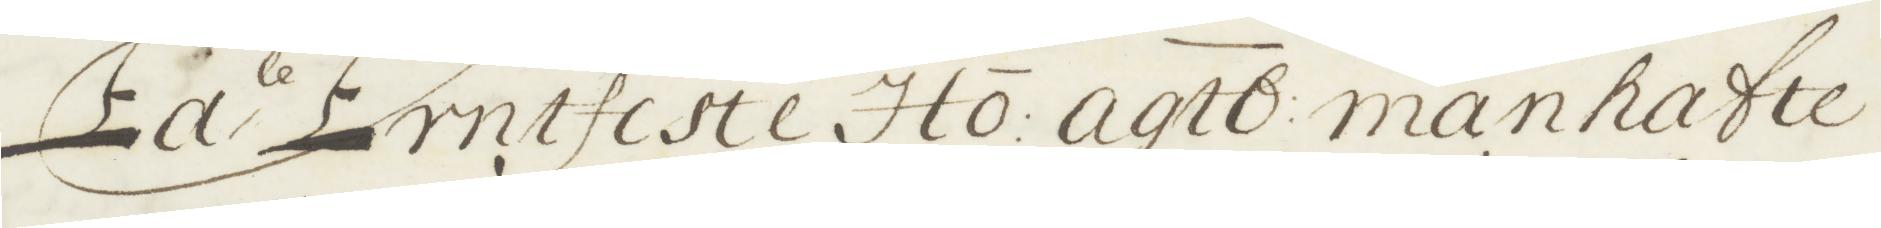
Ed,le Erntfeste Ho: agtb: manhafte
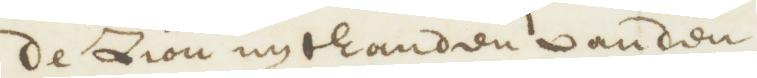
de zion uijthanden van den
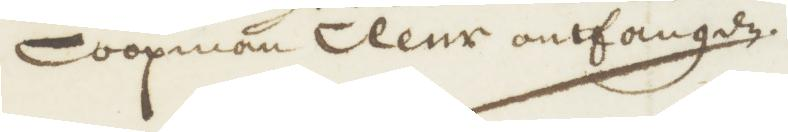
Coopman Cleur ontfangen.
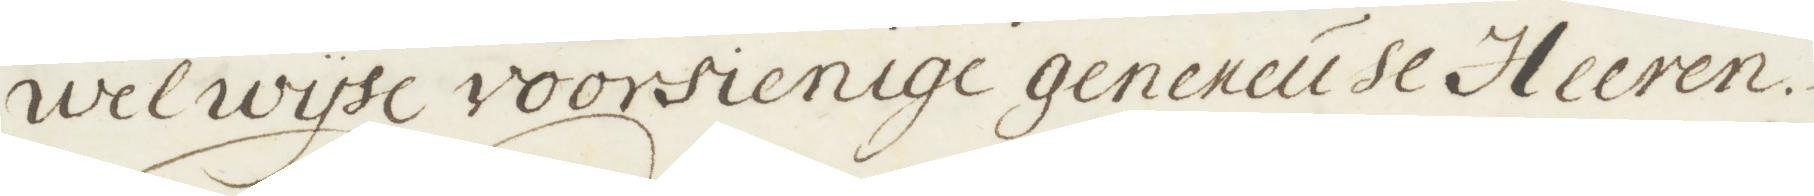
welwijse voorsienige genereuse Heeren.
